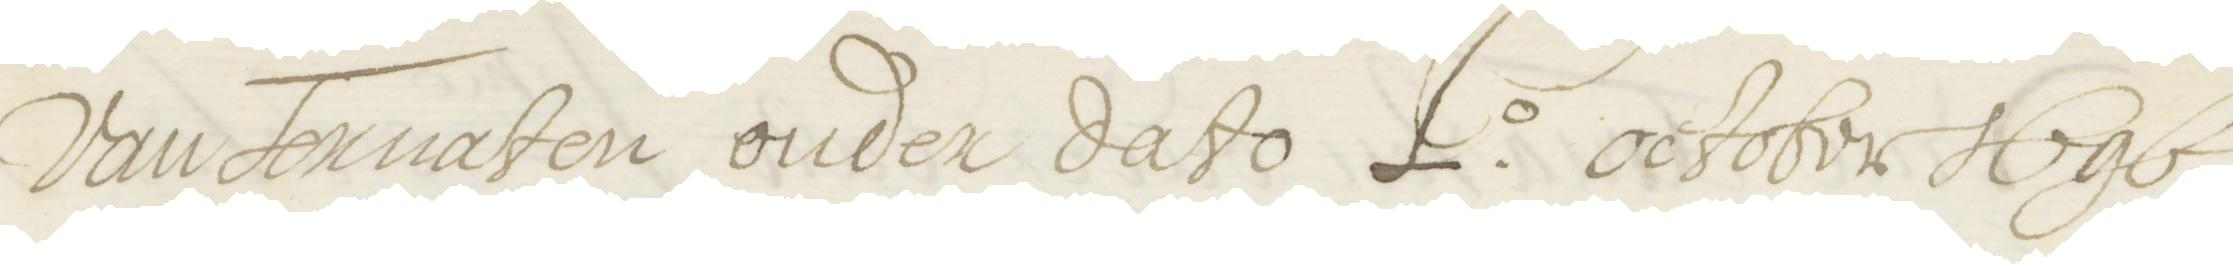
Van Ternaten onder dato P.o october 1696.
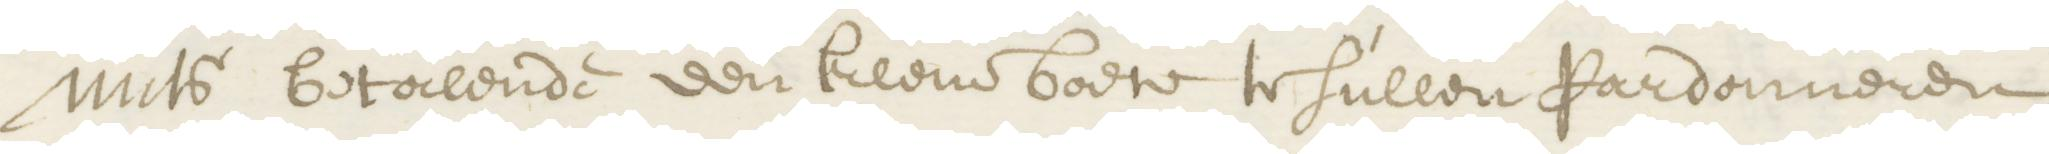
mits betalende een klene boete te sullen pardonneren,
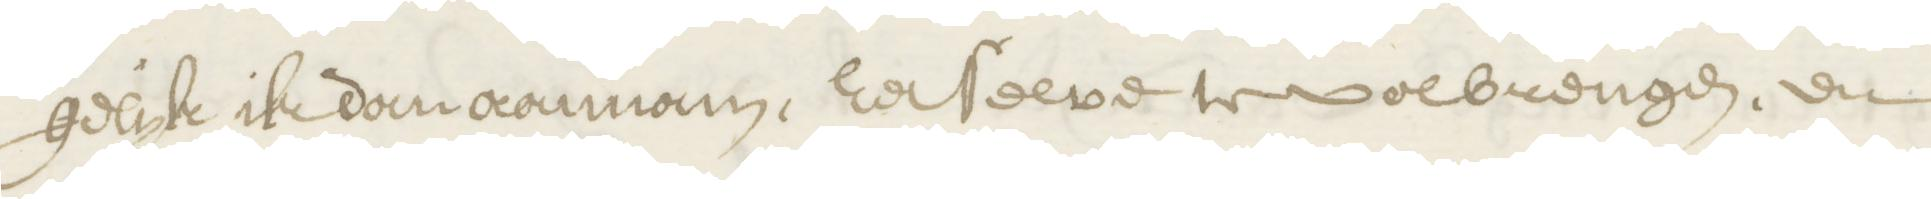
gelijk ik dan aannam, het selve te volbrengen, en
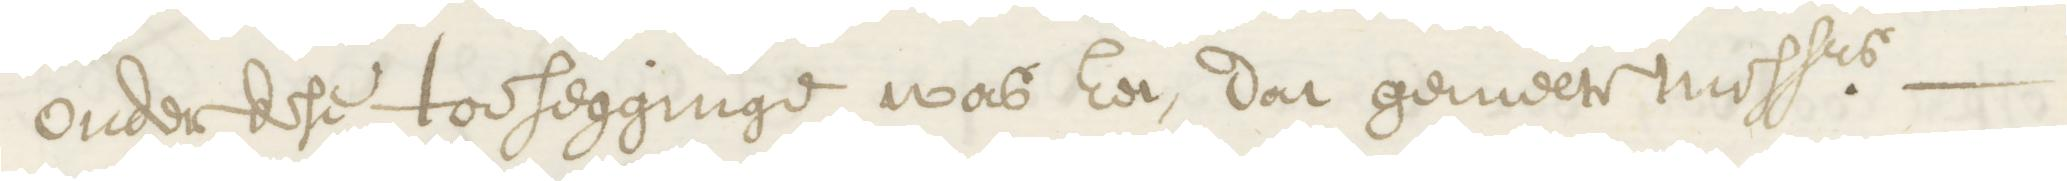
onder dese toesegginge was het, dat gemelte mess.rs —
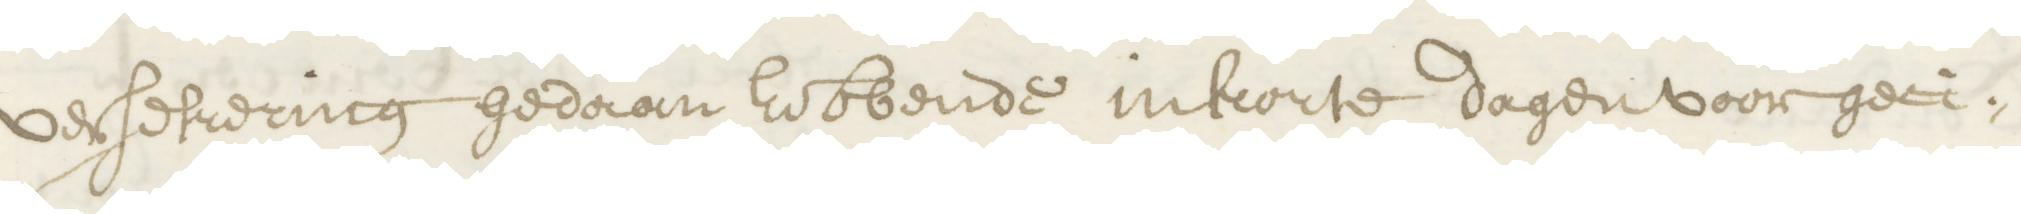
versekering gedaan hebbende in korte dagen voor geci„
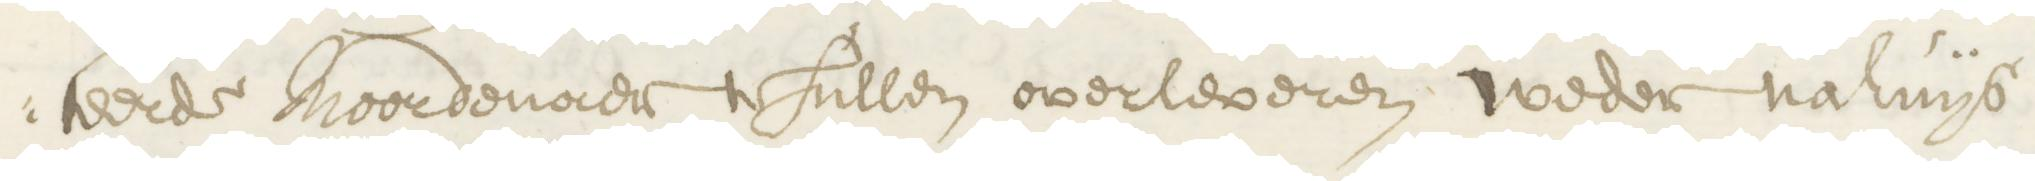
„teerde moordenaer te sullen overleveren weder nahuijs
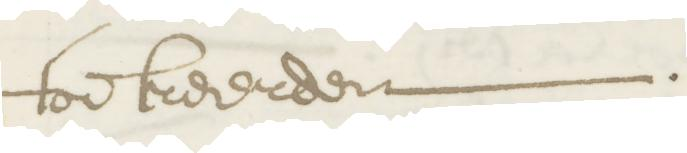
toe keerden.
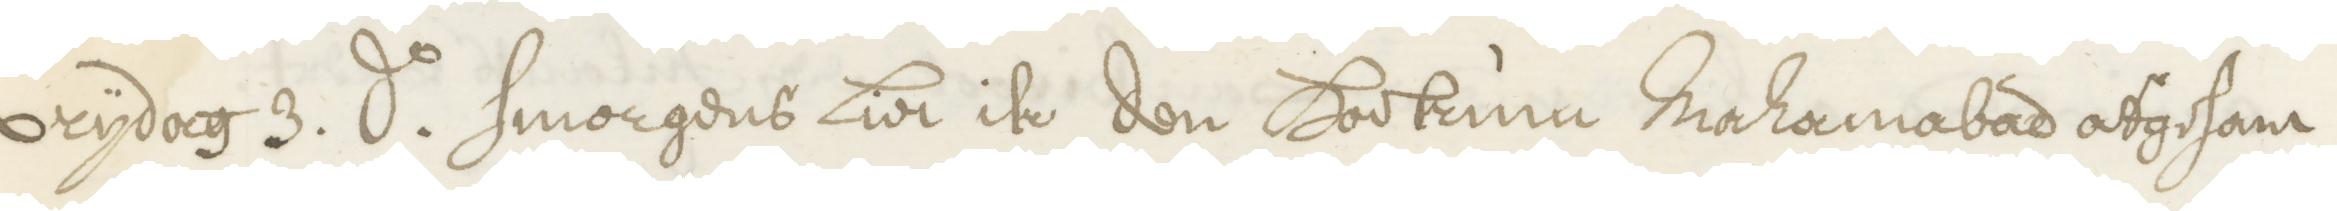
vrijdag 3. d.o smorgens liet ik den Hoekum Mahamabad afgesant
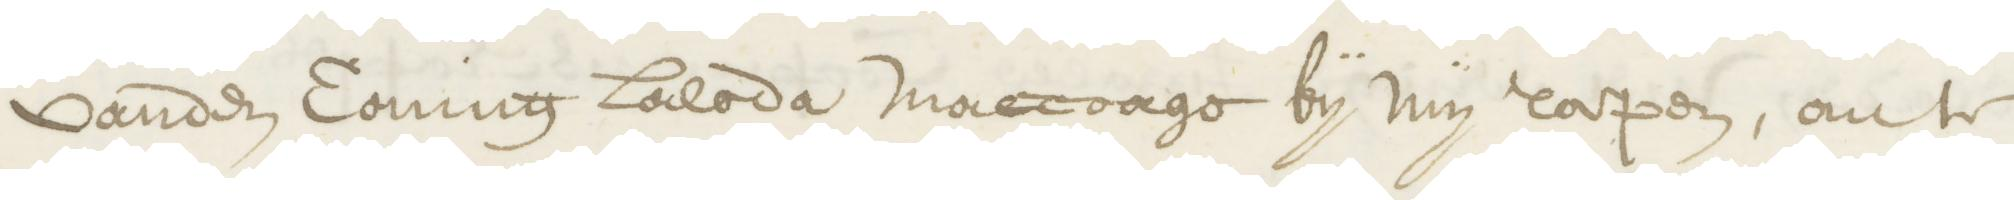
vanden Coning laloda maccoago bij mij roepen, om te
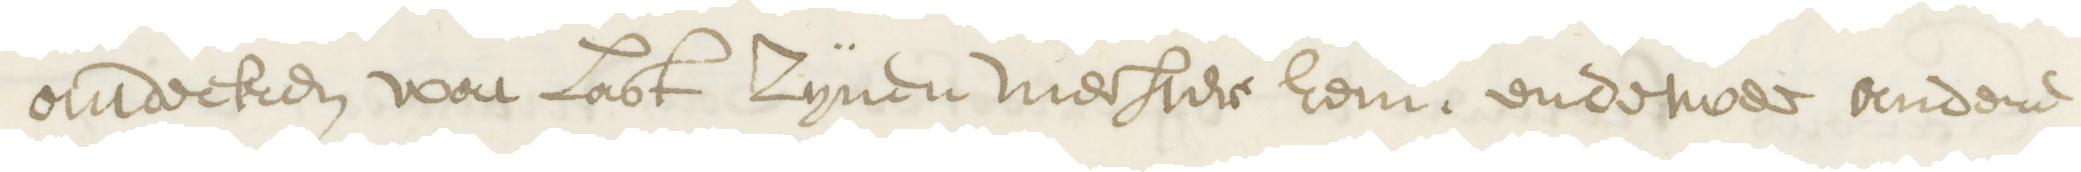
ontdecken wat last zijnen meester hem, ende twee andere
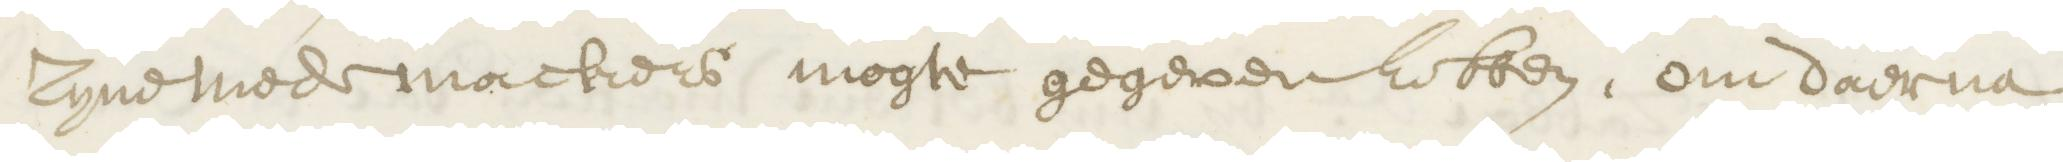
zijne mede mackers mogte gegeven hebben, om daer na
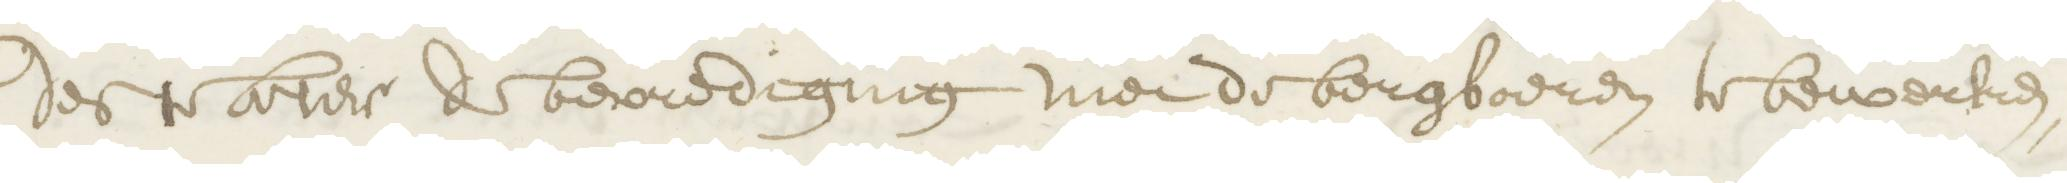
des te beter de bevrediging met de bergboeren te bewerken,
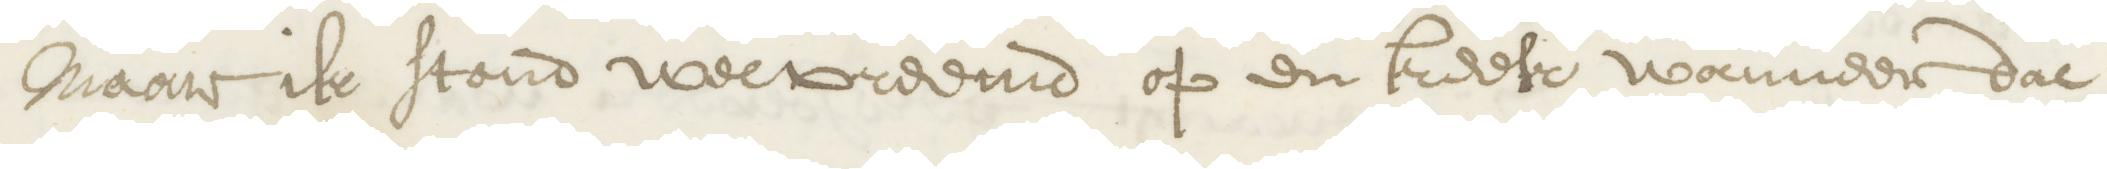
maar ik stond welvreemd op en keek wanneer dat
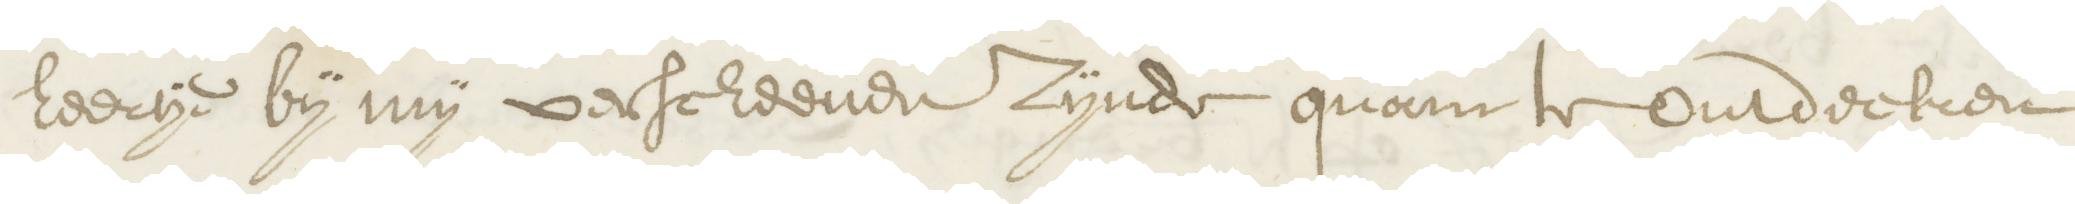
heertje bij mij verscheenen zijnde quam te ontdecken
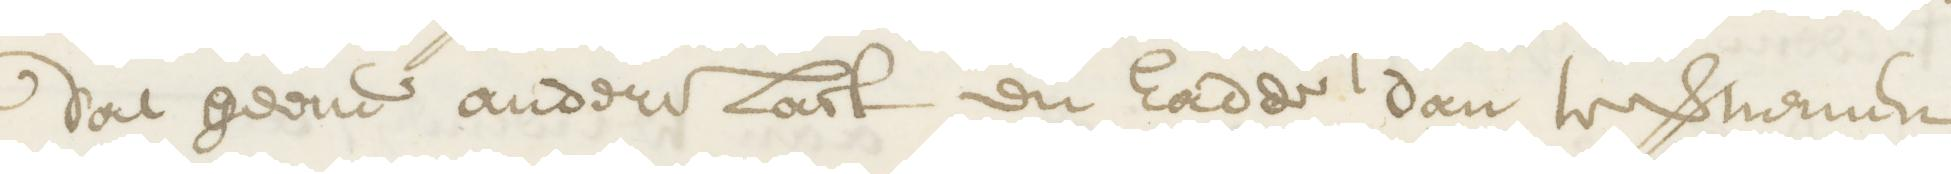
dat geene andere last en hadde dan te vernemen
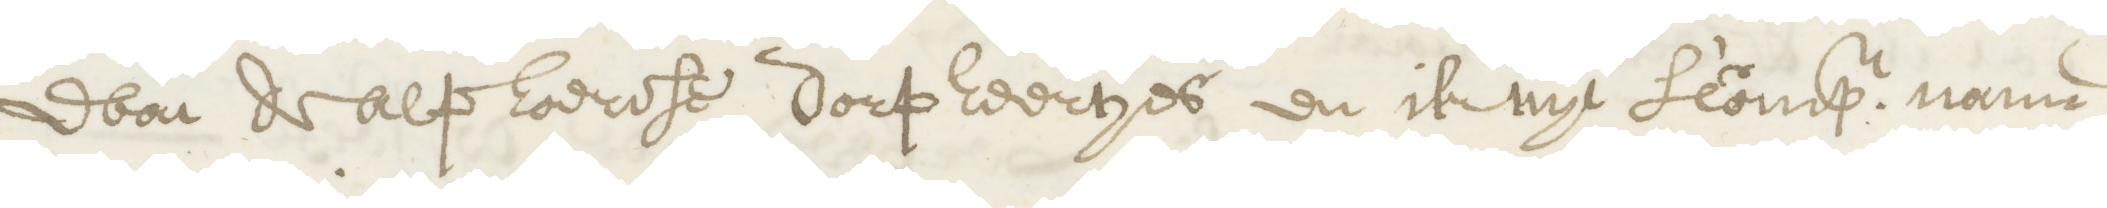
wat de alphoerese dorp heertjes en ik uijt s'comp.s name
